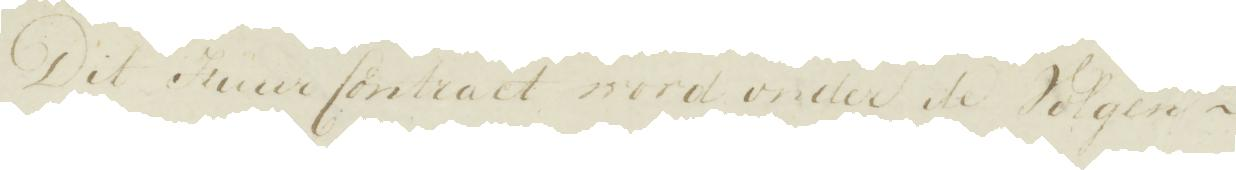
Dit Huur Contract word onder de Volgen —
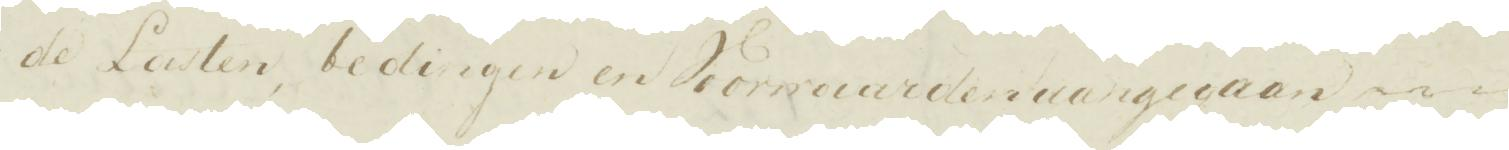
de Lasten bedingen en Voorwaarden aangegaan —
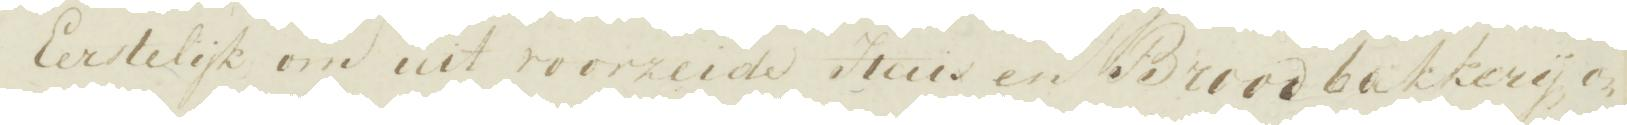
Eerstelijk om uit voorzeide Huis en Broodbakkerij, on
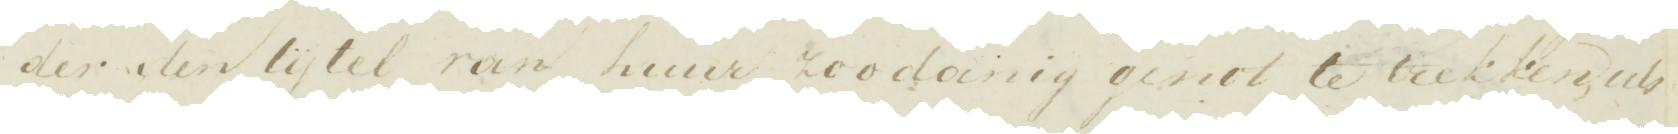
der den tijtel van huur, zoodanig genot te trekken, als
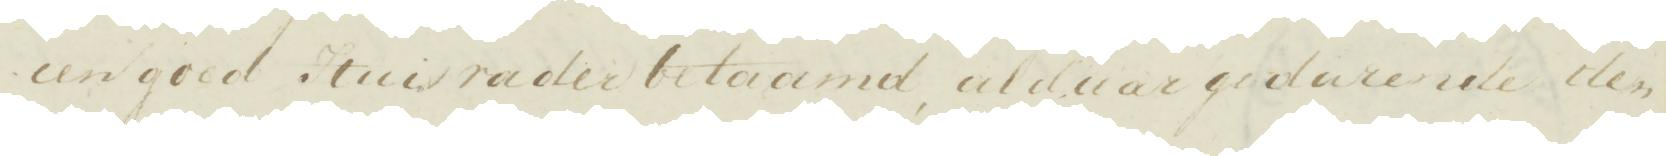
een goed Huisvader betaamd, aldaar gedurende den
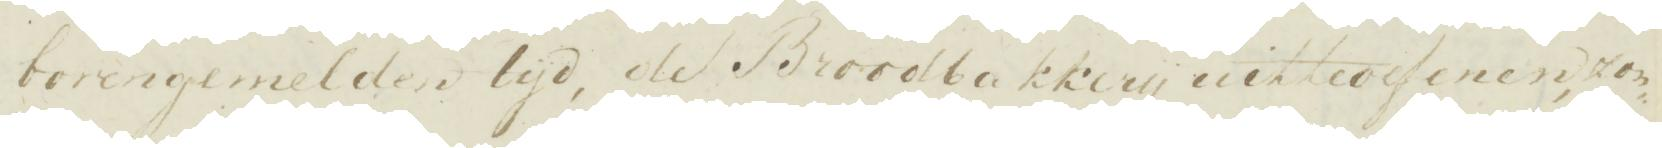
bovengemelden tijd, de Broodbakkerij uit te oefenen, zon„
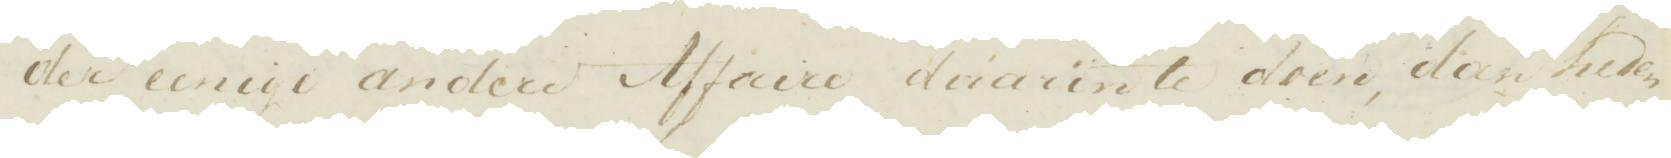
der eenige andere Affaire daarin te doen, dan heden
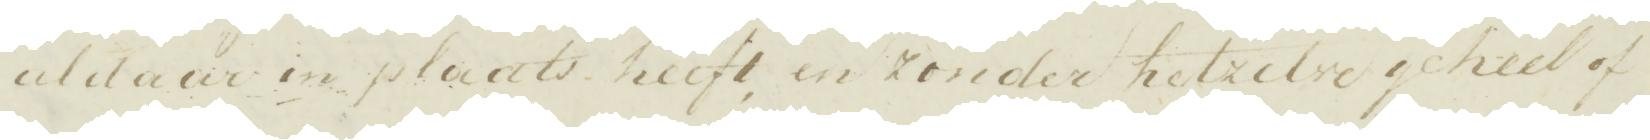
aldaar in plaats heeft, en zonder hetzelve geheel of
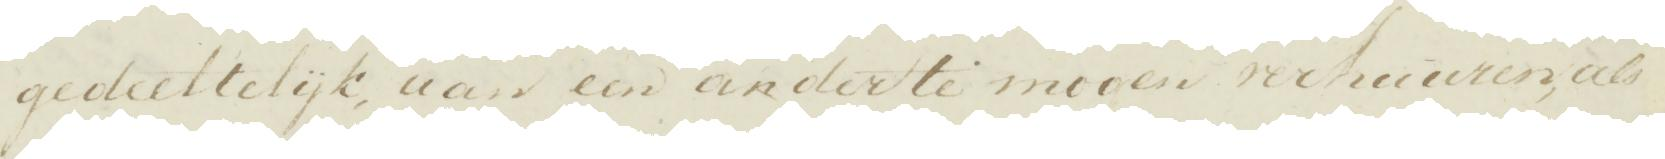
gedeeltelijk, aan een ander te mogen verhuuren, als
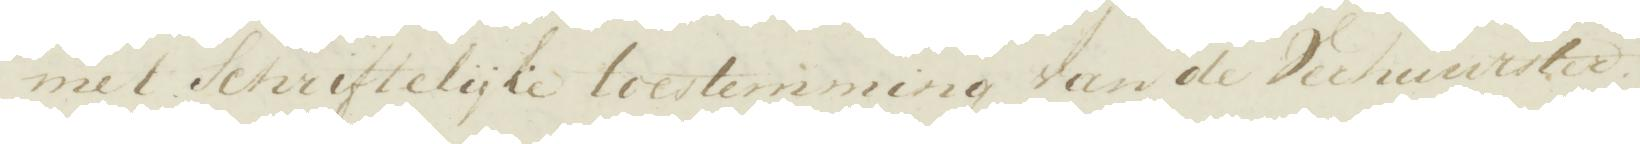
met schriftelijke toetemming van de Verhuurster.
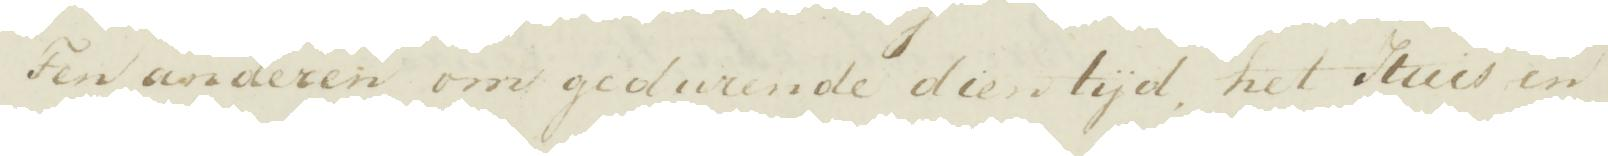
Ten anderen om gedurende dien tijd, het Huis en
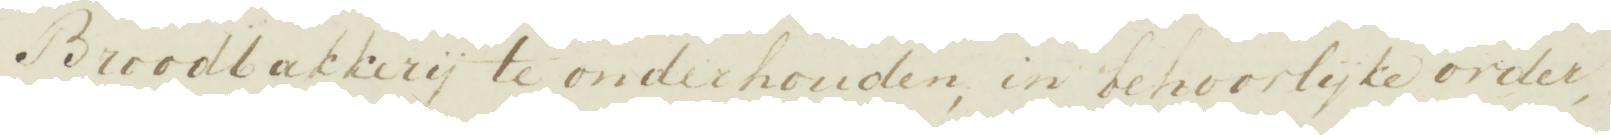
Broodbakkerij te onderhouden, in behoorlijke order,
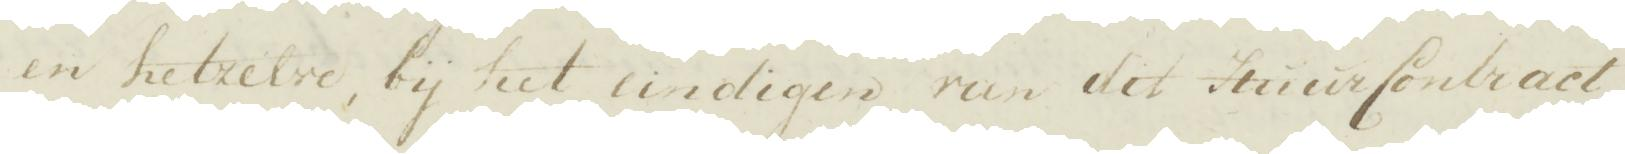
en hetzelve, bij het eindigen van dit Huur Contract
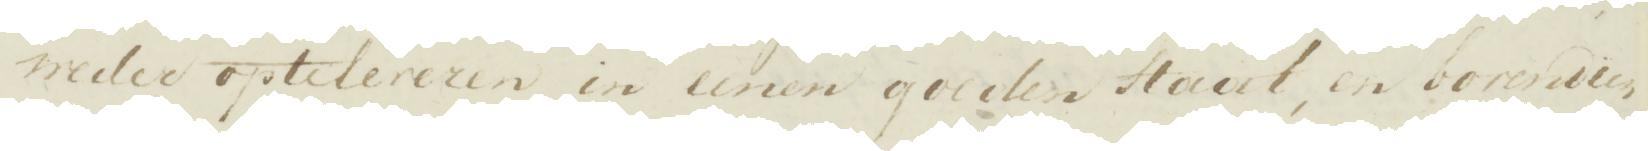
weder op te leveren, in eenen goeden staat, en bovendien
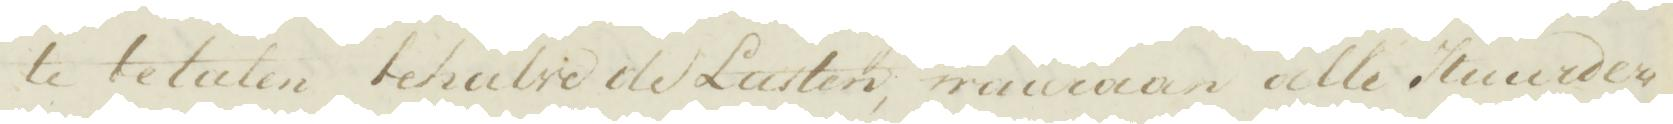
te betalen, te halve de Lasten, waaraan alle Huurder,
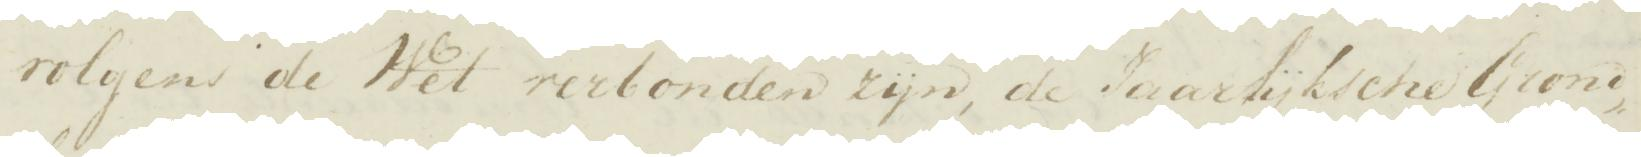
volgens de Wet verbonden zijn, de Iaarlijksche Grond„
